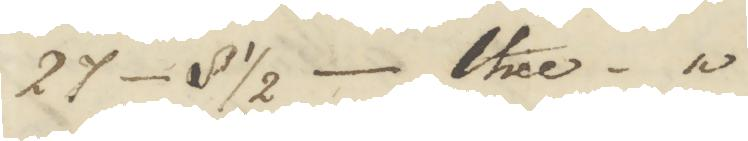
27 — 8½ — thee - a
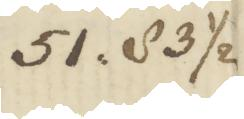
51:83½
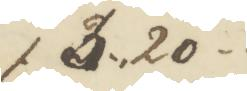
ƒ 3„20 -
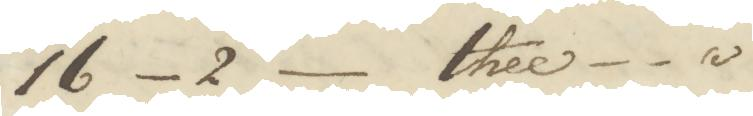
16 — 2 — thee - - a
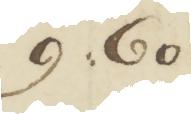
9:60
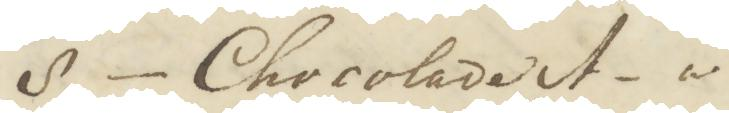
8 — Chocolade A - a
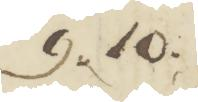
9:10.
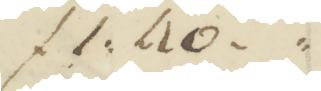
ƒ1: 40 - :
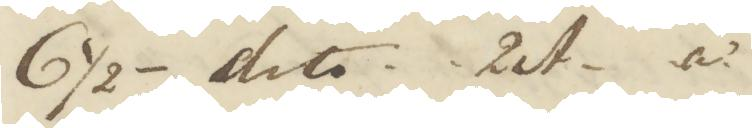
6½- dito. . 2A - a.
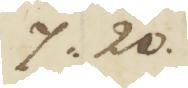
7: 20.
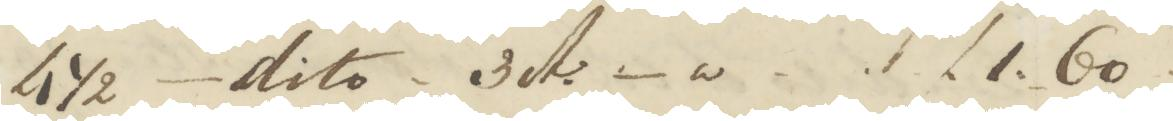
4½ — dito - 3A - a - . ƒ 1:60
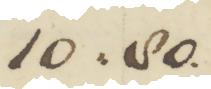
10: 80.
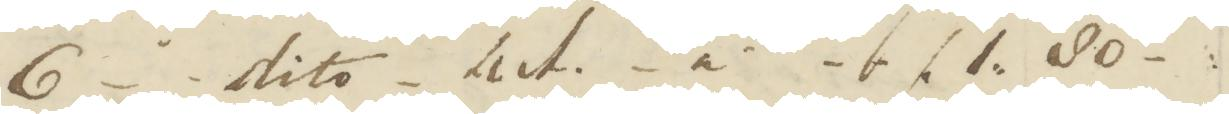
6 - - dito - 4A. - a'- - ƒ1: 80 - :
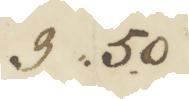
3: 50
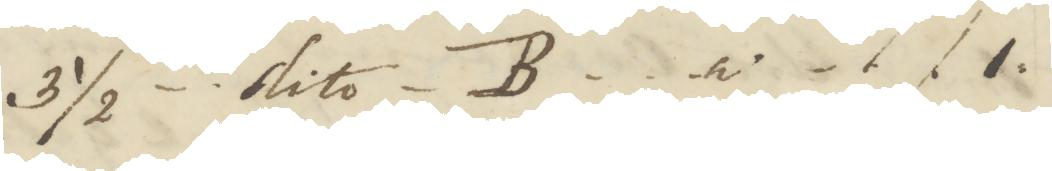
3½ - . dito - B - . _a'- ƒ 1:
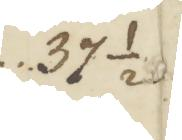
„37½
